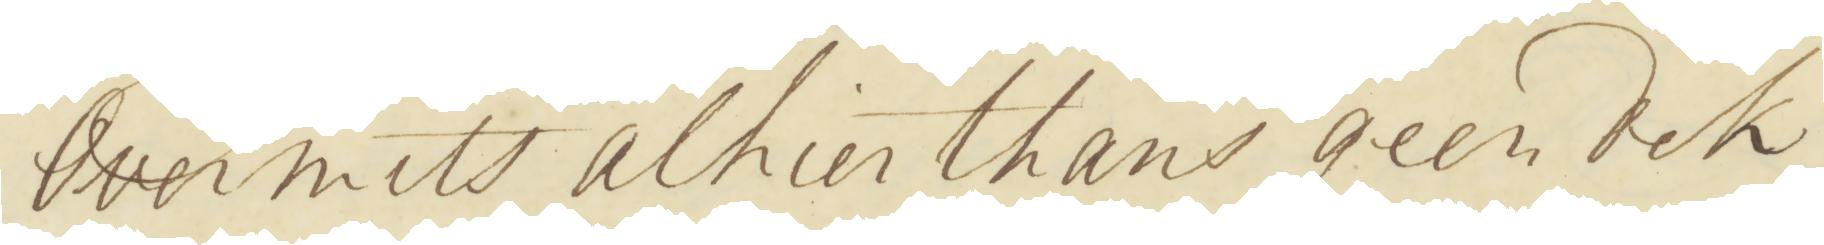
Overmits alhier thans geen dik
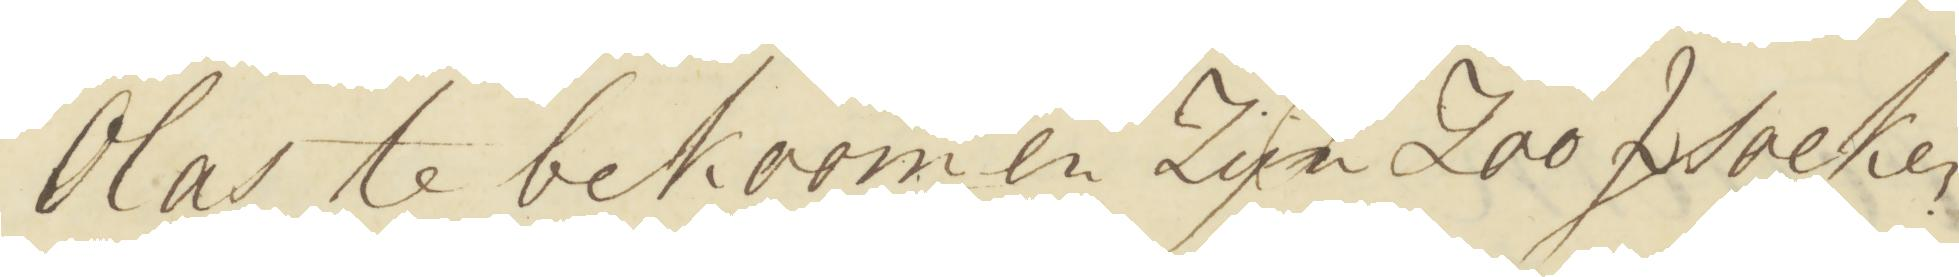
Olas te bekoomen zijn zoo versoeken
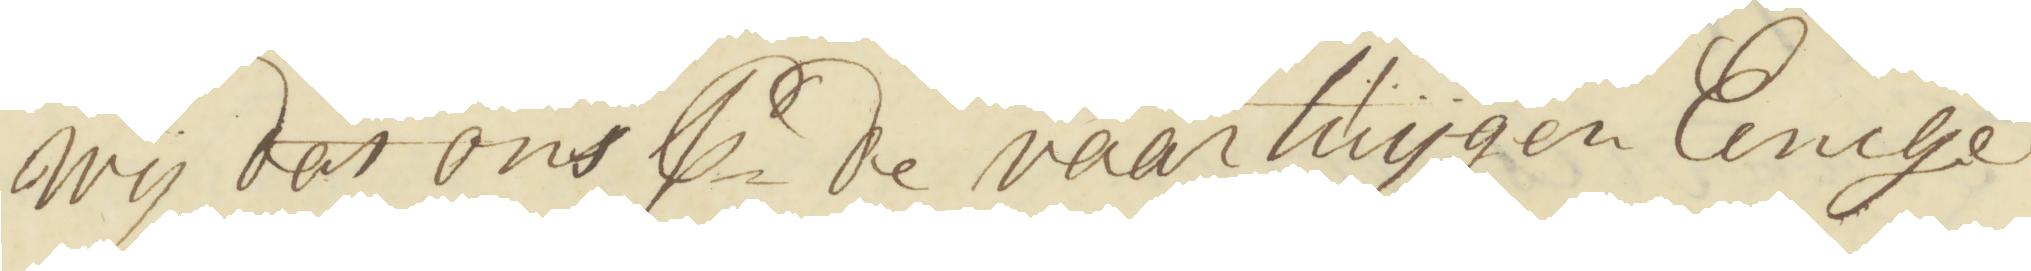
wij dat ons p=s de vaartuijgen Eenige
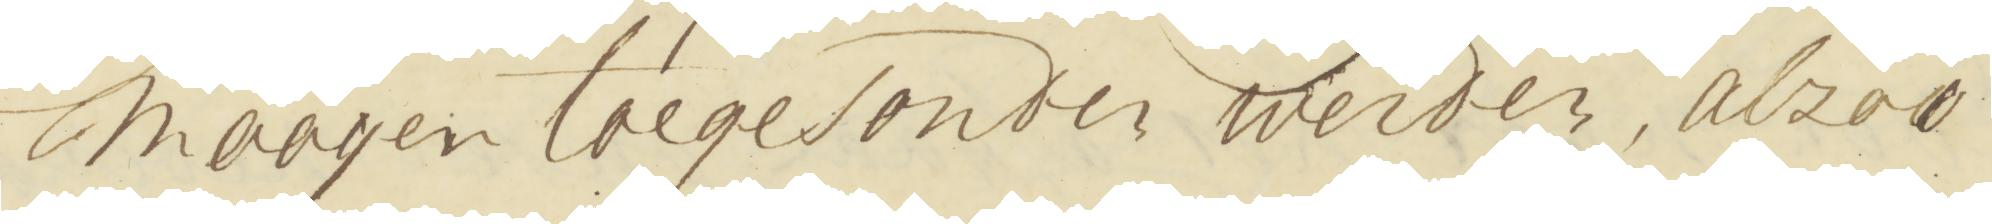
moogen toegesonden werden, alzoo
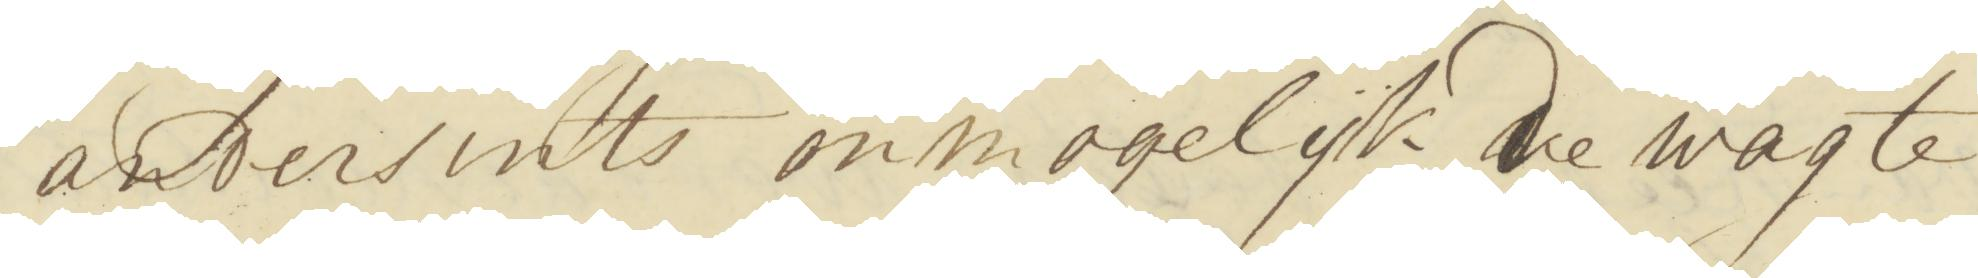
andersints onmogelijk de wagte
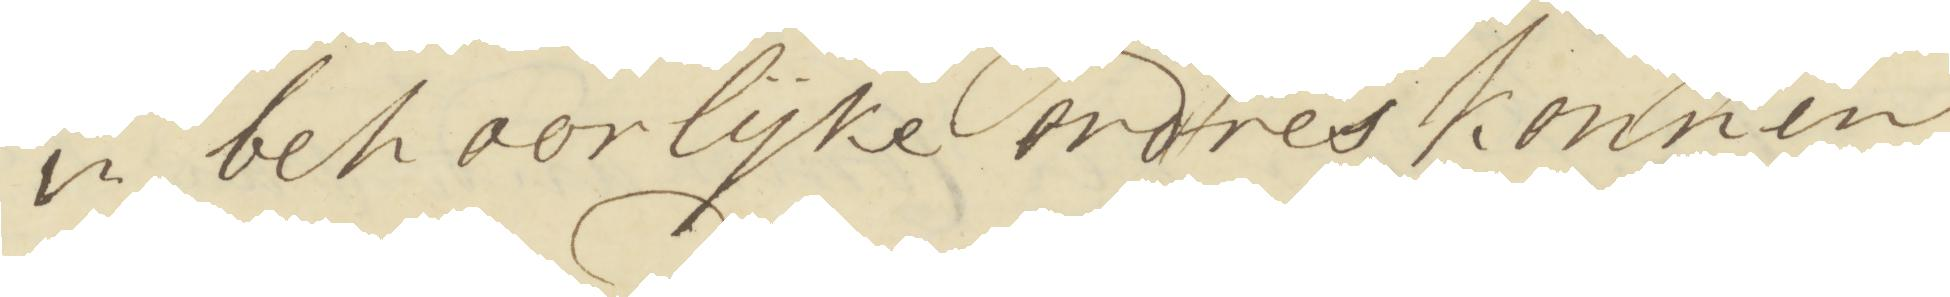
in behoorlijke ordres konnen
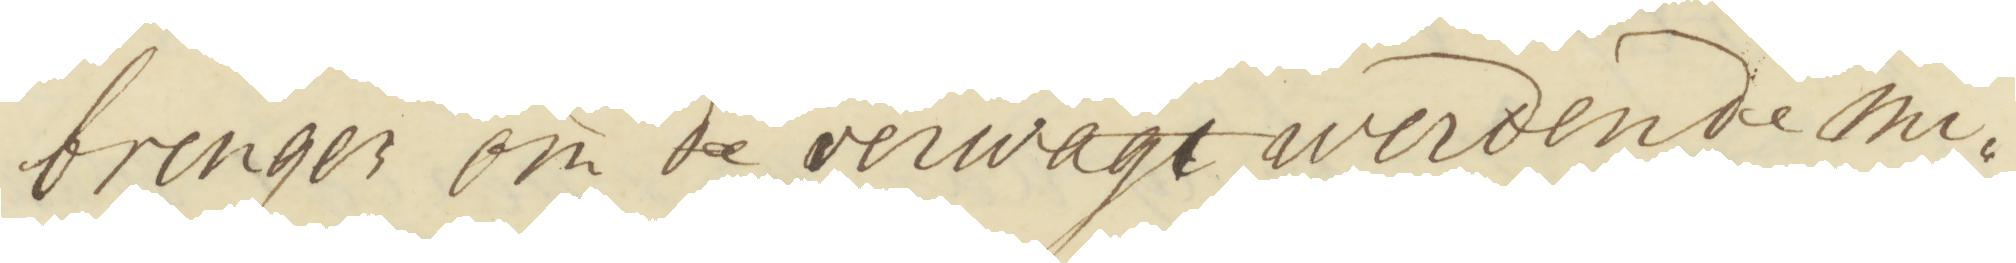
brengen om de verwagt werdende mi„
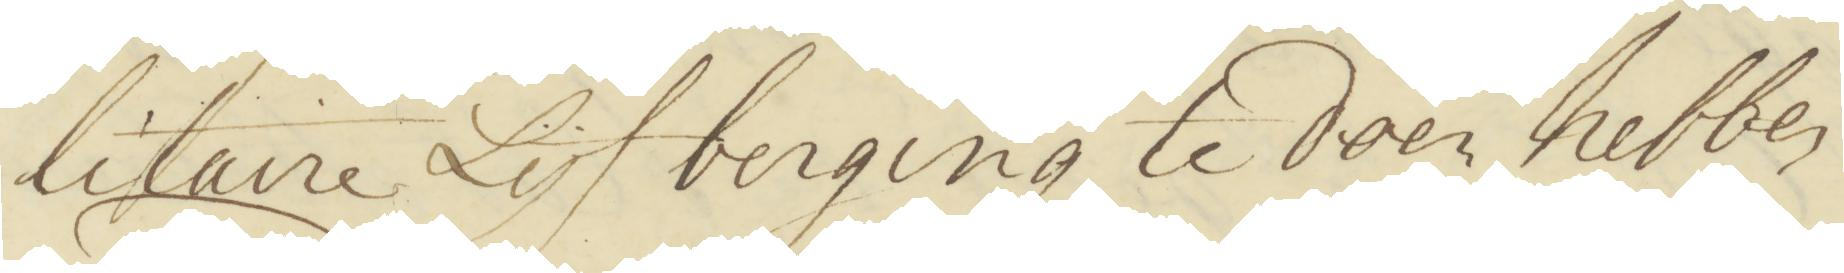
litaire Lijfberging te doen hebben
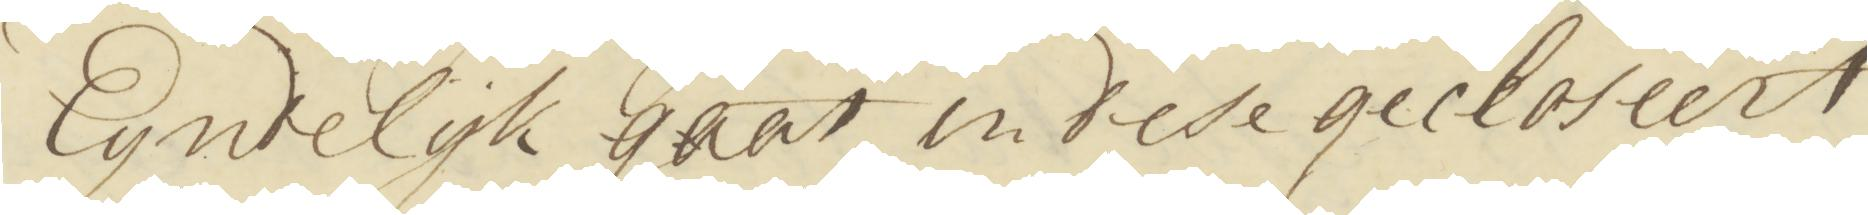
Eyndelijk gaat in dese gecloseert
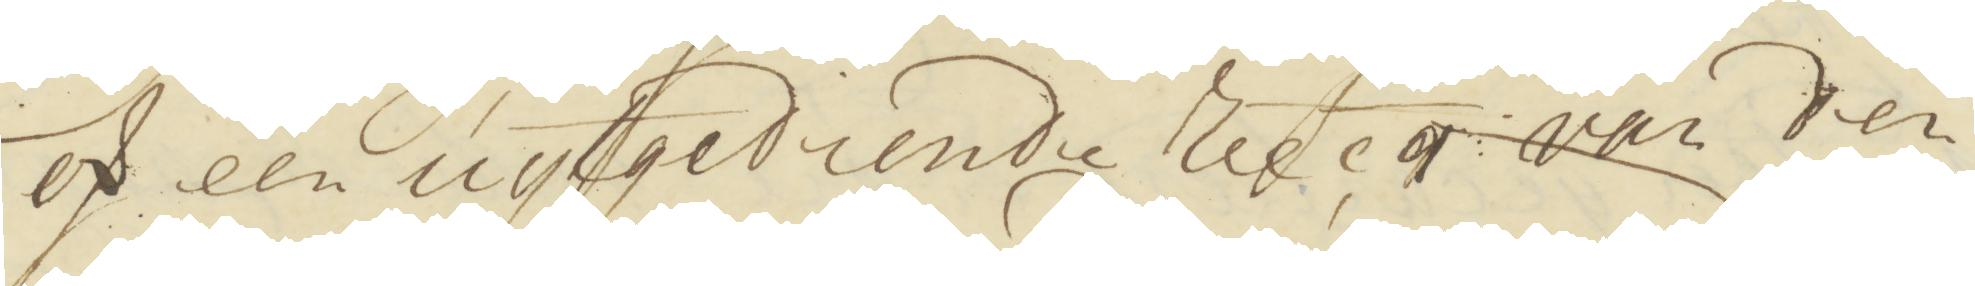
over een uytgediende reecq: van den
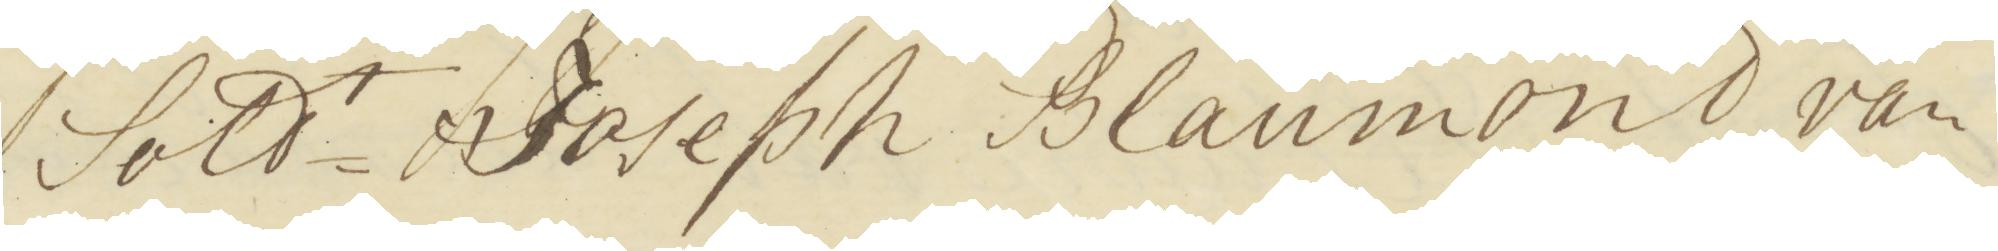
sold=t Ioseph Blaumond van
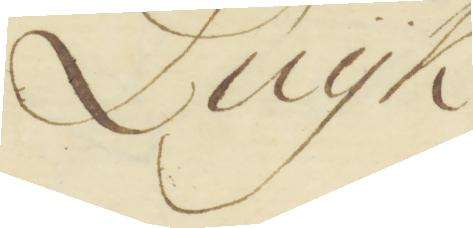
Luijk
